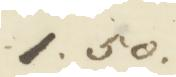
1. 50.
